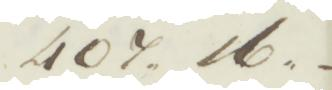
407„ 16„-
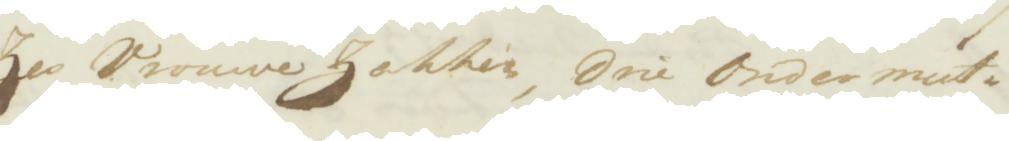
Zes Vrouwe Zakken, drie ondermut„
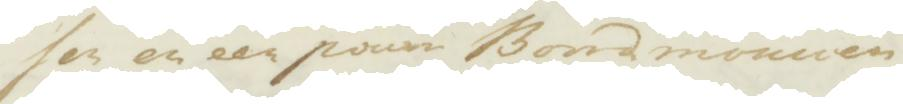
sen en een paar Boordmouwen,
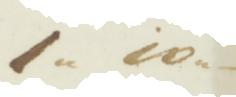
1„ 10„-
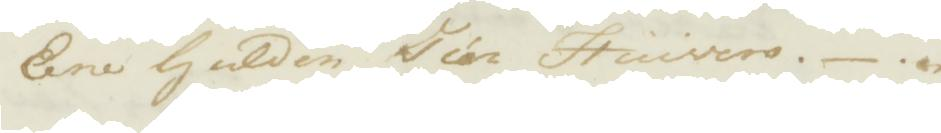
Eene Gulden Vier Stuivers . — .
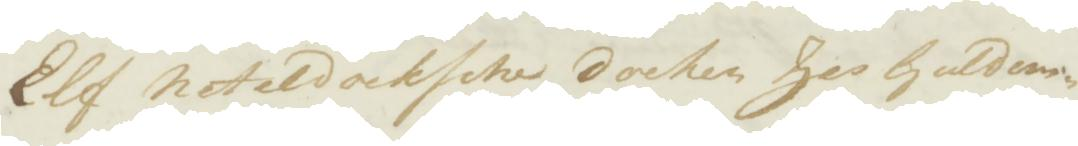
Elf neteldoeksche doeken Zes Guldens„
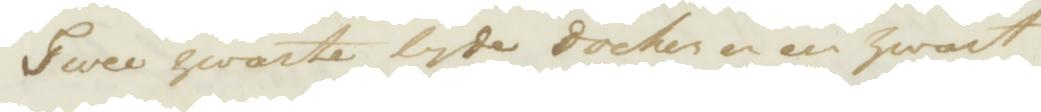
Twee zwarte zyde doeken en een zwart
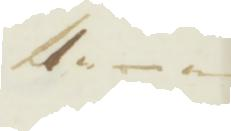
4„ —
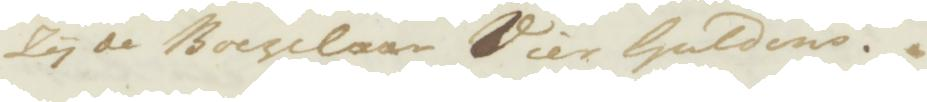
zijde Boezelaar Vier Guldens. „
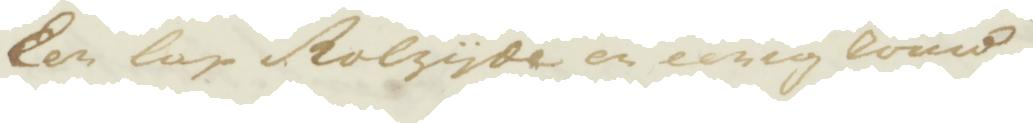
Een lap Rolzijde en eenig rouw
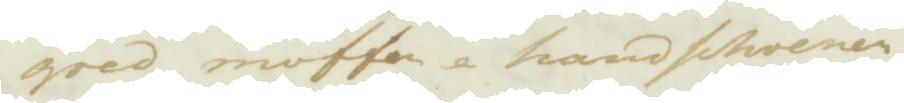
goed, moffen en handschoenen,
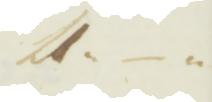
4 „ — „
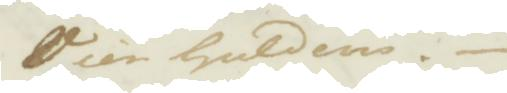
Vier Guldens.—
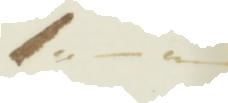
1 „ — „-
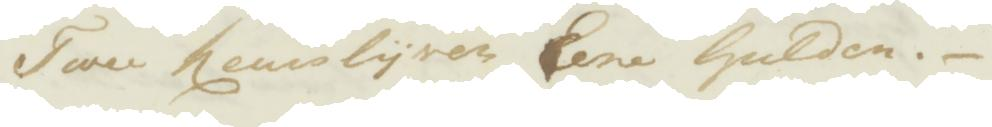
Twee keurslijven, Eene Gulden.—
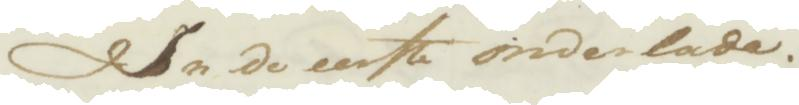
In de eerste onderlade.
